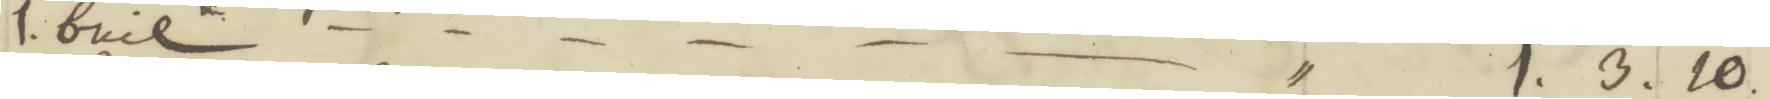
1. brie - - - - - - „ 1. 3. 10.
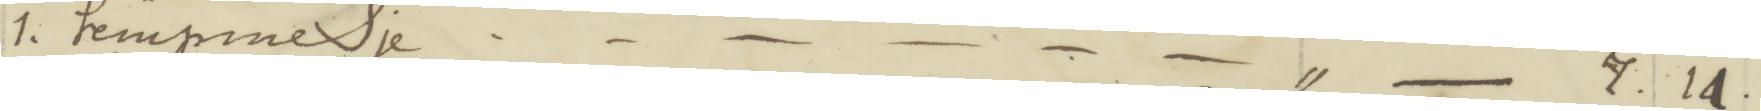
1. knipmesje - - - - - - „ — 7. 14.
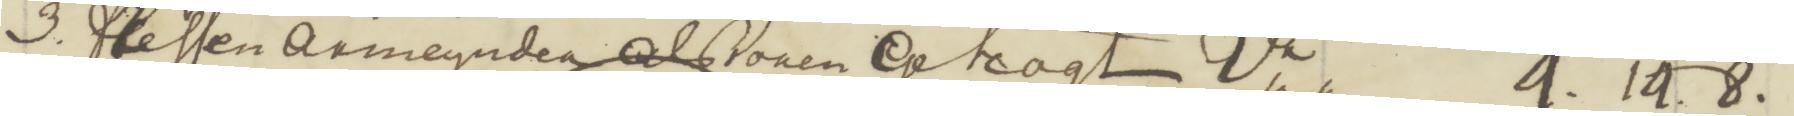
3. flessen armeijnder als voren gekogt V„r „ 4. 14. 8.
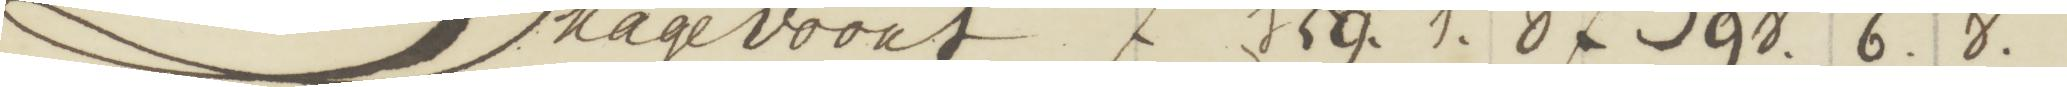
Dragevoort ƒ 159. 1. 8 ƒ 398. 6. 8.
